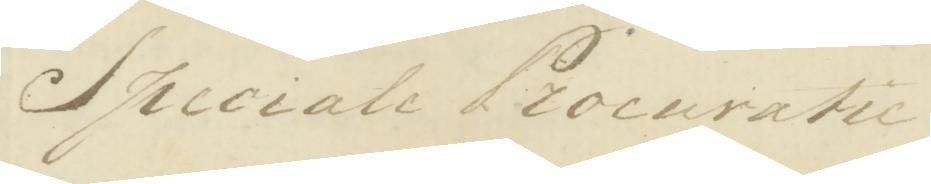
Speciale Procuratie
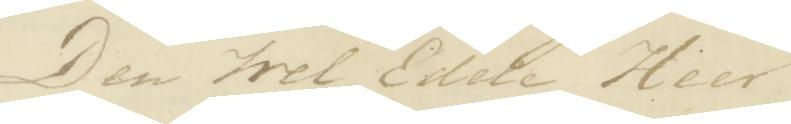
Den Wel Edele Heer
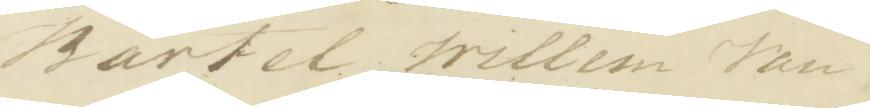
Bartel Willem van
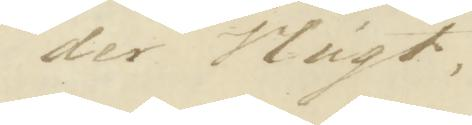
der Vlugt.
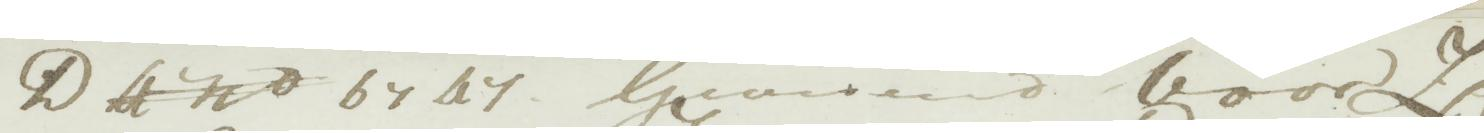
D 4 no 6747 Geviseerd voor Zeegel ontvan
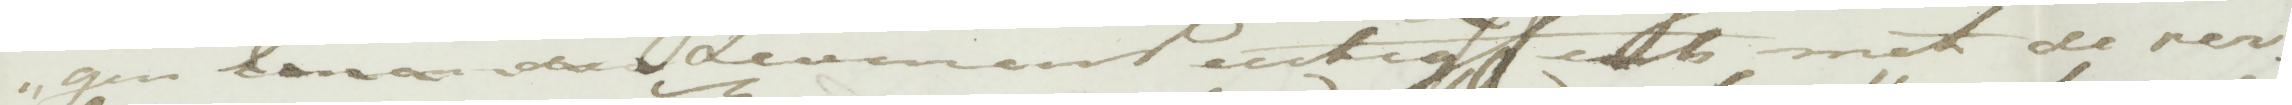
„gen Somma van Zevenenveertig Cents met de ver
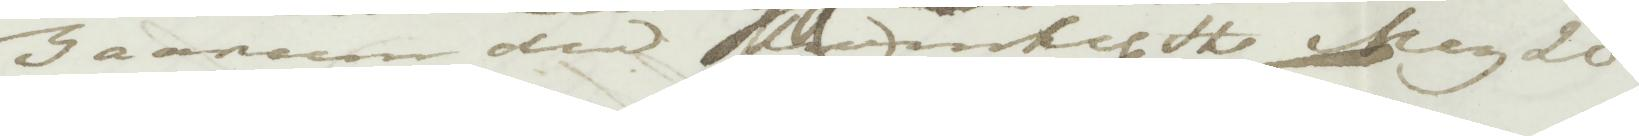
Haarlem den twintigsten Mey 20
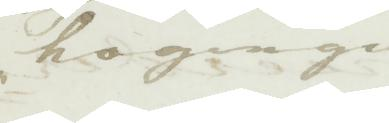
hogingen
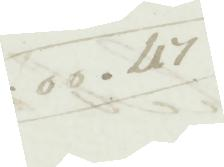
ƒ 00.47
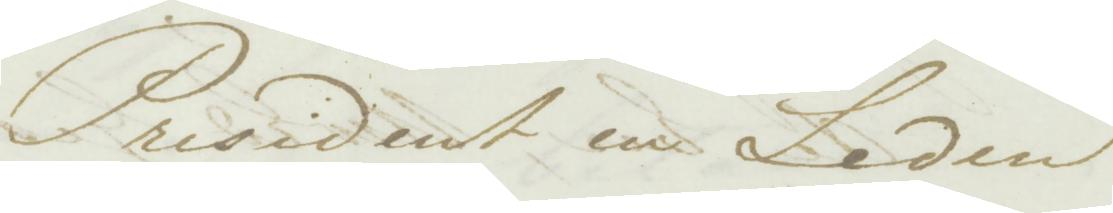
President en Leden
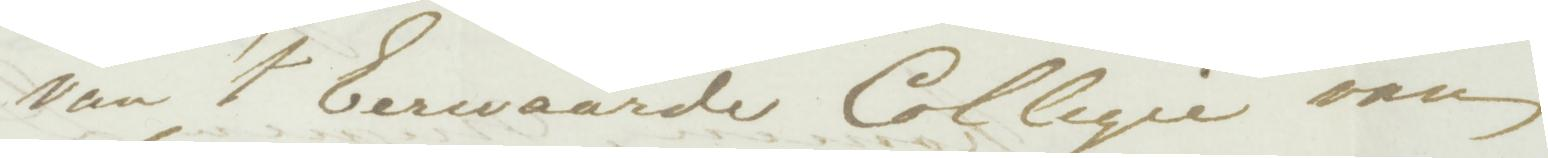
van ’t Eerwaarde Collegie van
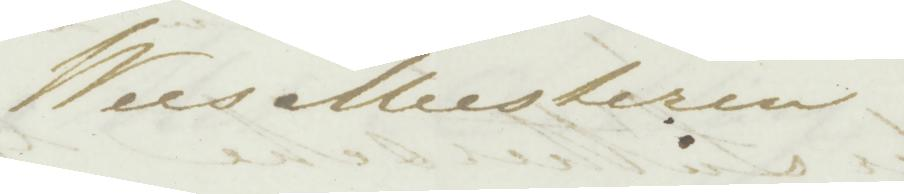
Wees Meesteren
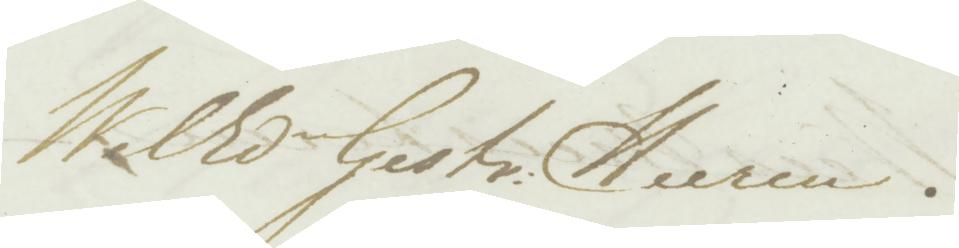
WelEd Gestr: Heeren.
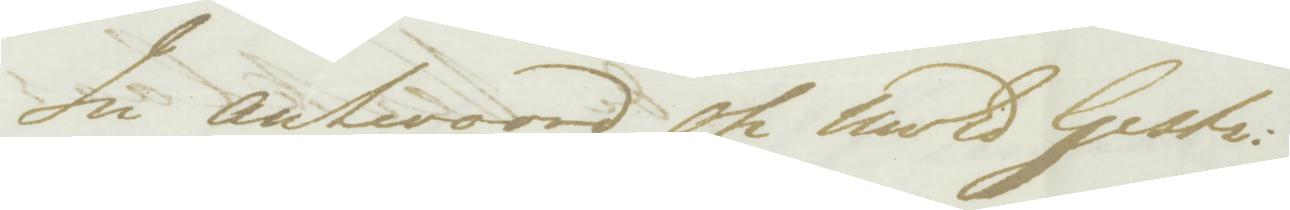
In antwoord op uwEd Gestr:
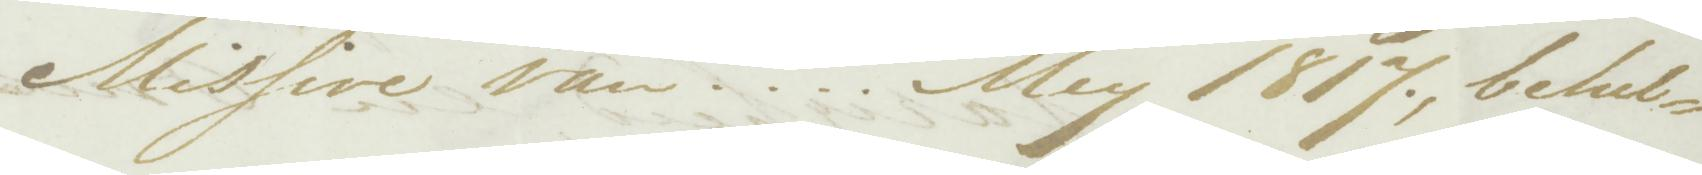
Missive van . . Mey 1817., behel=
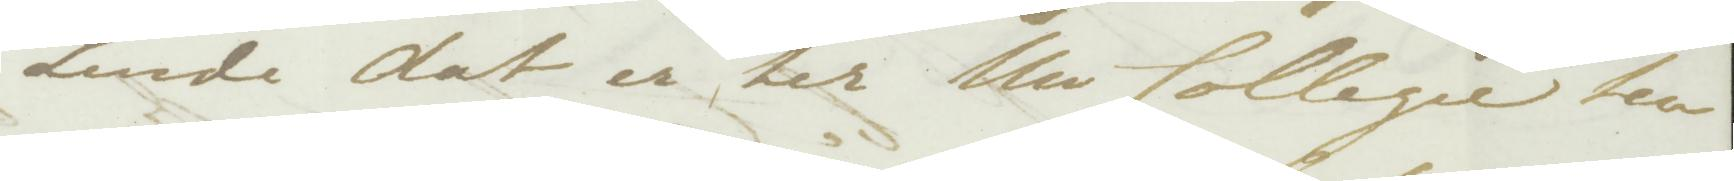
zende dat er, ter Uw Collegie ten
